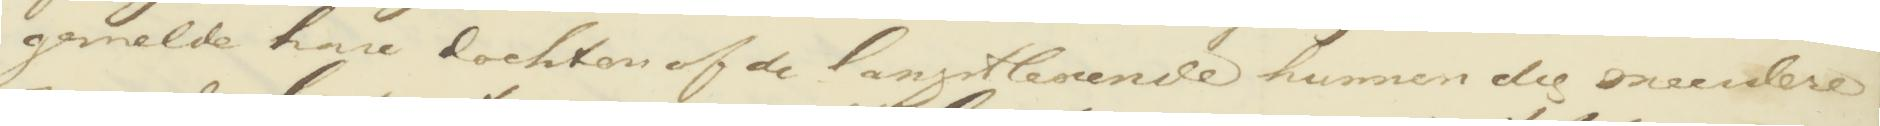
gemelde hare dochter of de langstlevende hunnen die meerdere
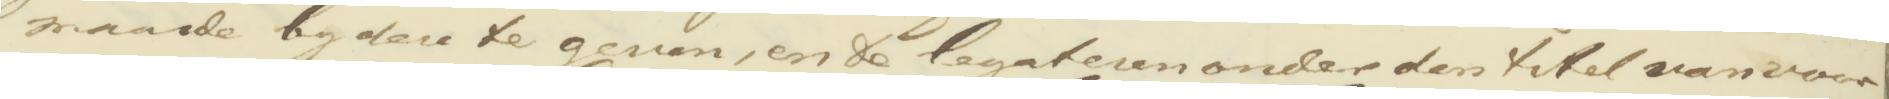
waarde by deze te geven, en te legateren onder den titel van voor
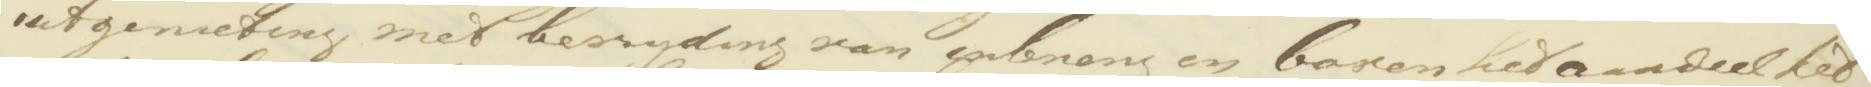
uitgenieting met bevryding van inbreng en boven het aandeel het
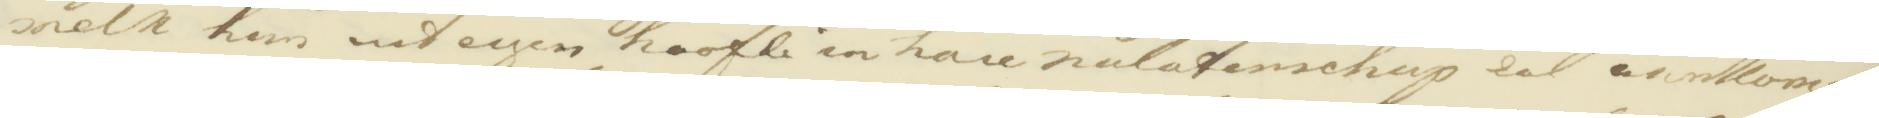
welk hun uit eigen hoofde in hare nalatenschap zal aankomen
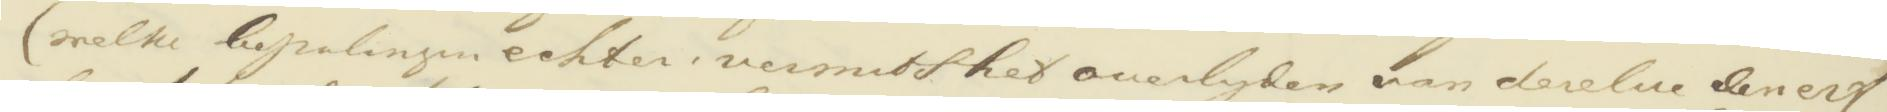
(welke bepalingen echter, vermits het overlyden van dezelve den erf
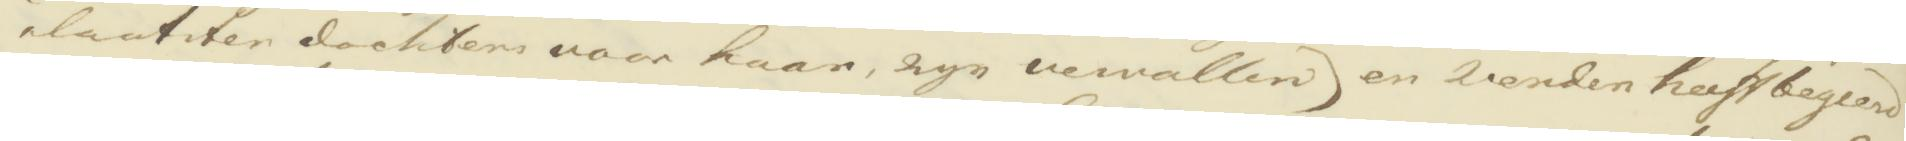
laatster dochters voor haar, zyn vervallen) en verder heeft begeerd
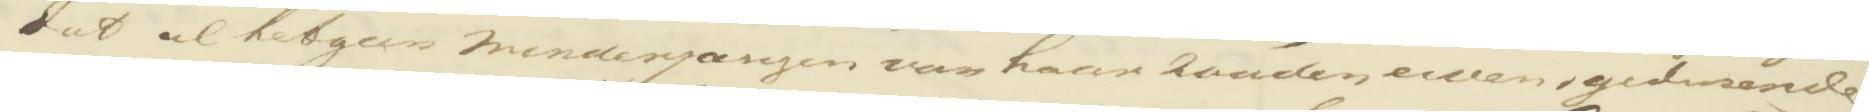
dat al hetgeen minderjarigen van haar zouden erven, gedurende
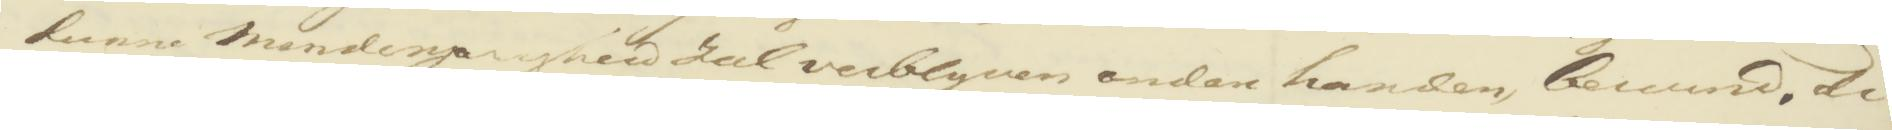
hunne minderjarigheid zal verblyven onder handen, bewind, di
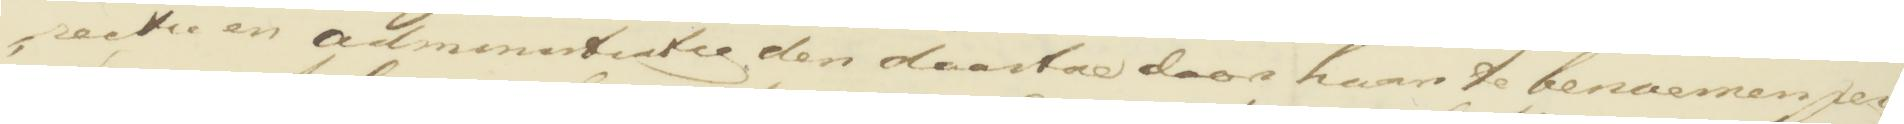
„rectie en administiatie den daartoe daar haar te benoemen per
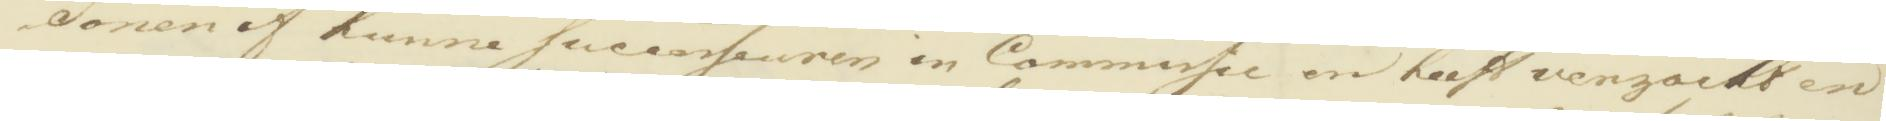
„sonen of hunne successeuren in Commissie en heeft verzocht en
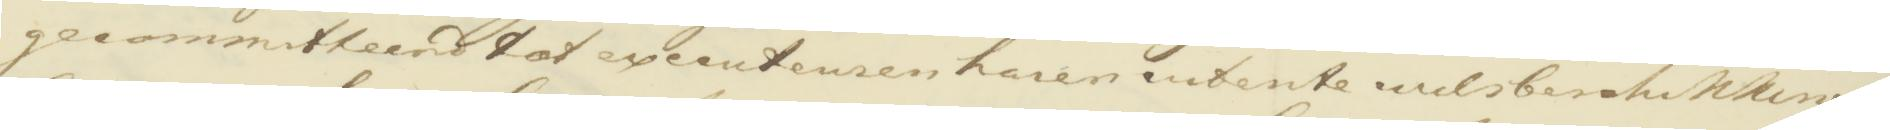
gecommitteerd tot executeuren haren uiterste wilsbeschikkingen
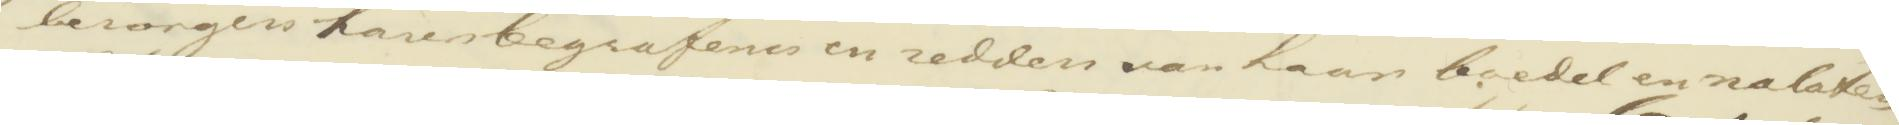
bezorgers haren begrafenis en redders van haar boedel en nalaten
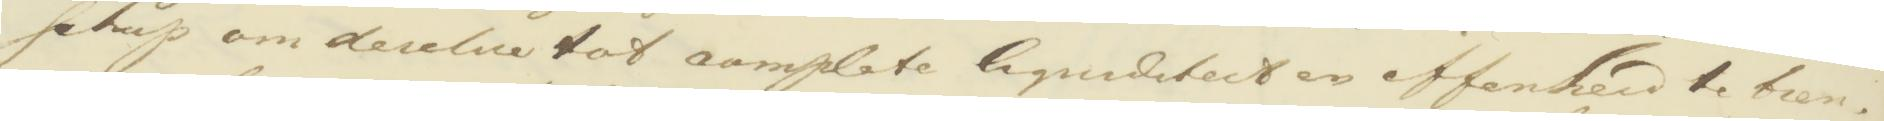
schap om deselve tot complete liquiditeit en effenheid te bren,
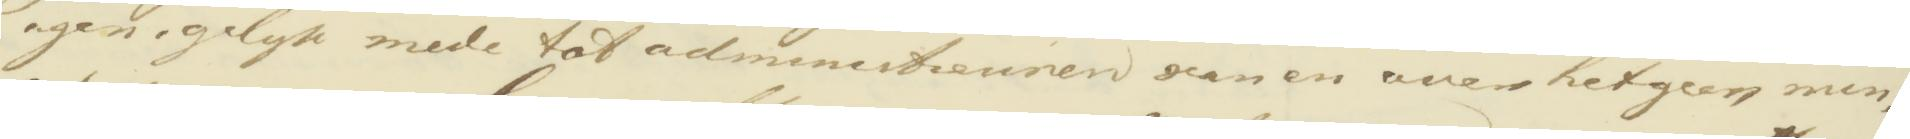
gen, gelyk mede tot administreuren van en over hetgeen min,
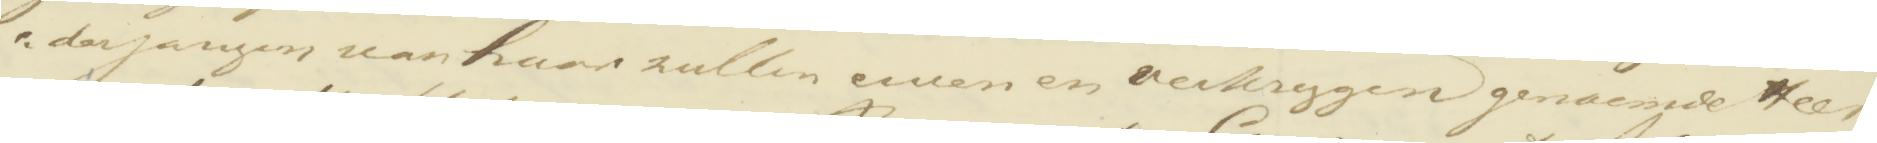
„derjarigen aan haar zullen erven en verkrygen genoemde Heer
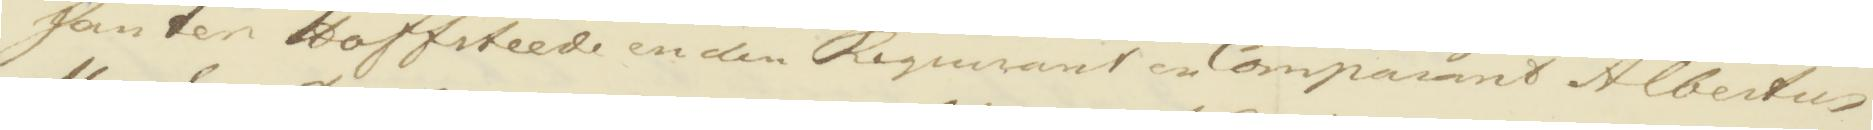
Jan ter Hoffsteede en den Requirant en Comparant Albertus
